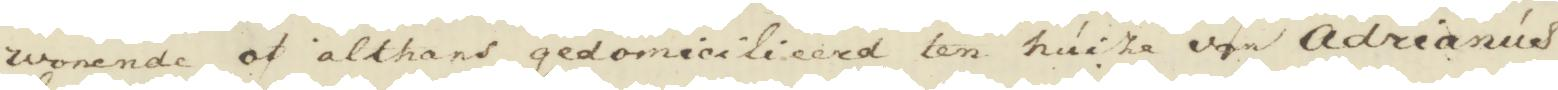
wonende, of althans gedomicilieerd ten huize van Adrianus
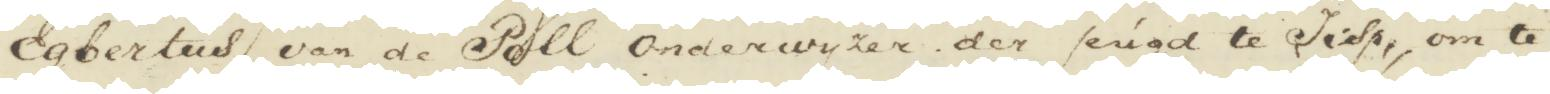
Egbertus van de Poll onderwyzer der jeugd te Jisp, om te
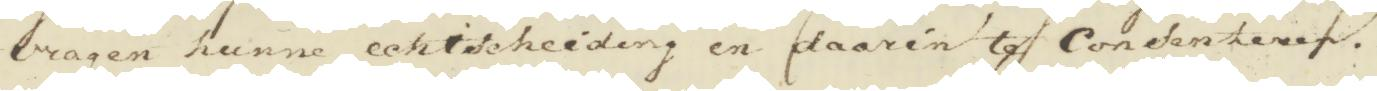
vragen hunne echtscheiding en daarin te consenteren.
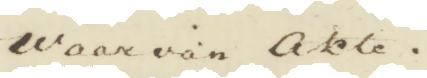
waar van Akte
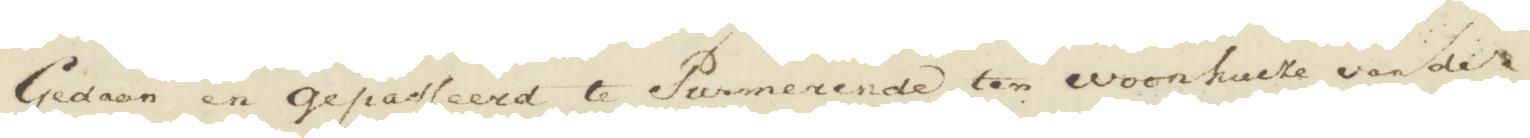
Gedaan en gepasseerd te Purmerende ten woonhuize van de
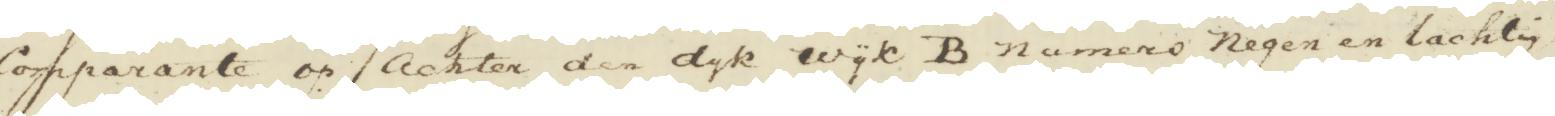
Comparante op achter den dyk wijk B numero Negen en tachtig
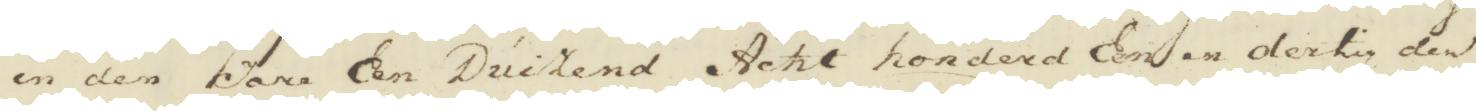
in den Jare Een Duizend Acht honderd Een en dertig den
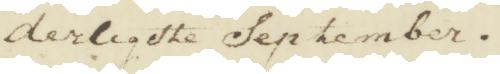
dertigste September.
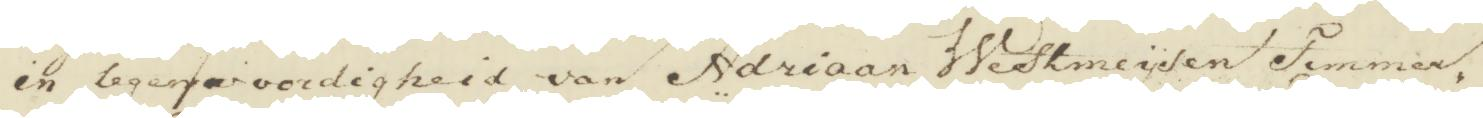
in tegenwoordigheid van Adriaan Westmeijsen Timmer„
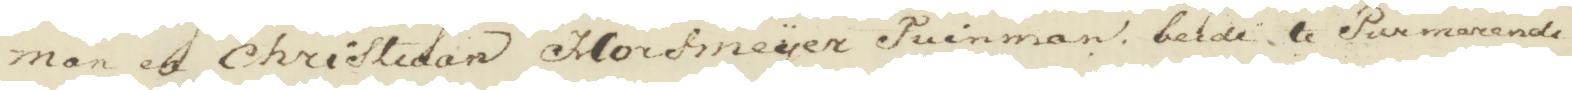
man en Christiaan Horsmeijer Tuinman, beide te Purmerende
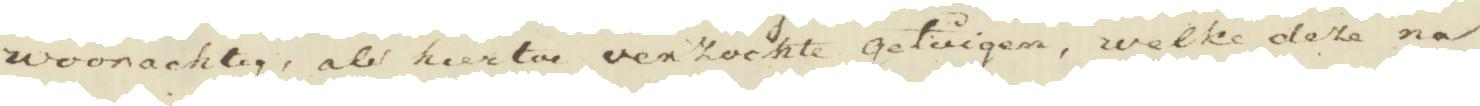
woonachtig, als hiertoe verzochte getuigen, welke deze na
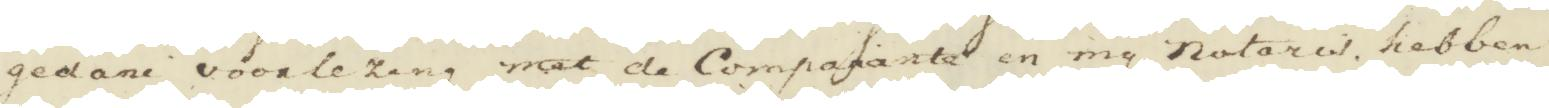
gedane voorlezing met de Comparante en my notaris, hebben
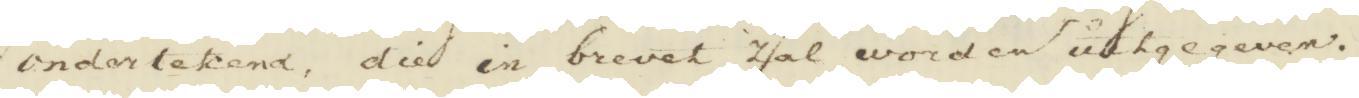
ondertekend, die in brevet zal worden uitgegeven.
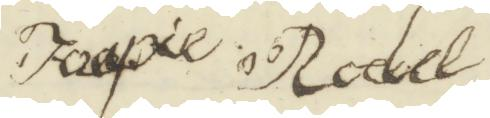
Jaapie Roelel
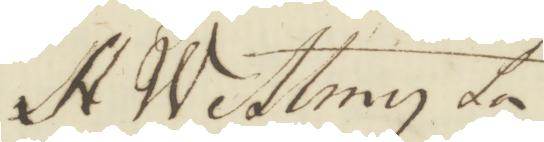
A Westmy La
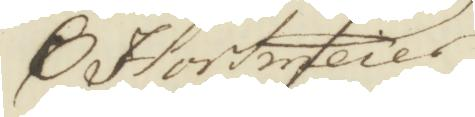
G Horsmeier
